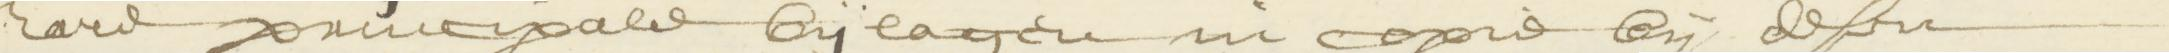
hare principale bijlagen in copie bij desen
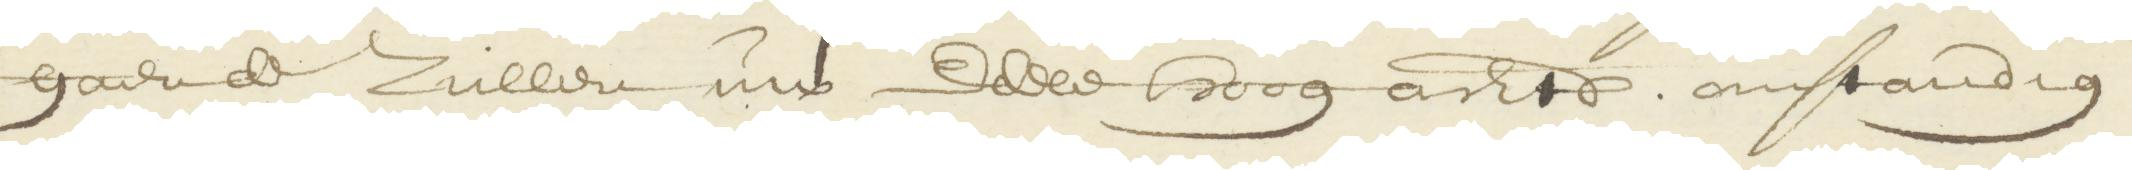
gaende zullen uw Edele hoog achtb. omstandig
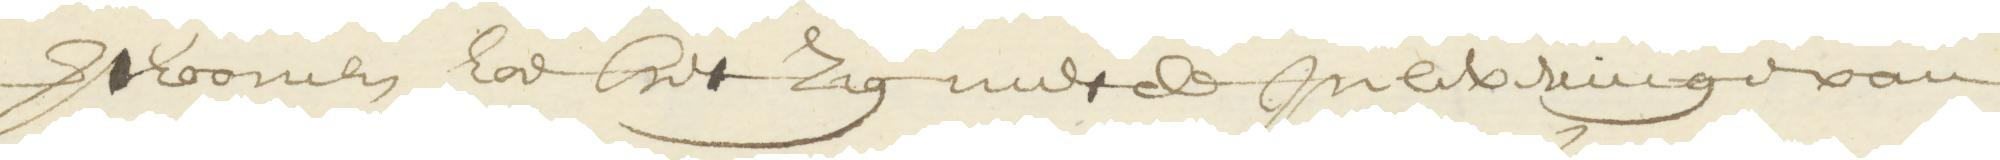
verthoonen hoe het zig met de jnleveringe van
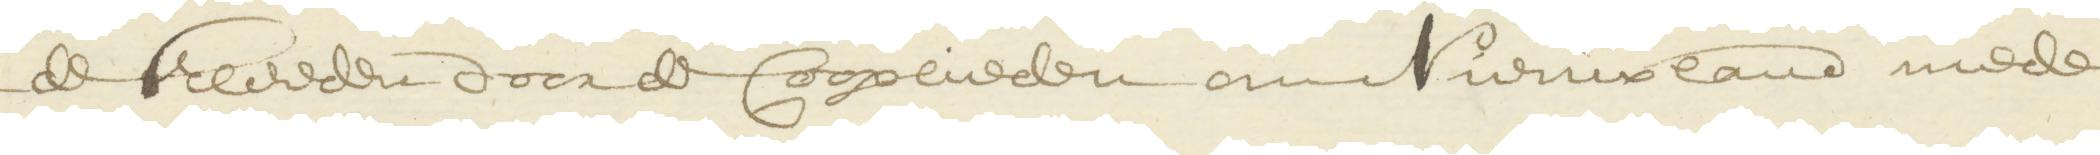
de kleeden door de Cooplieden om Nieuwland mede
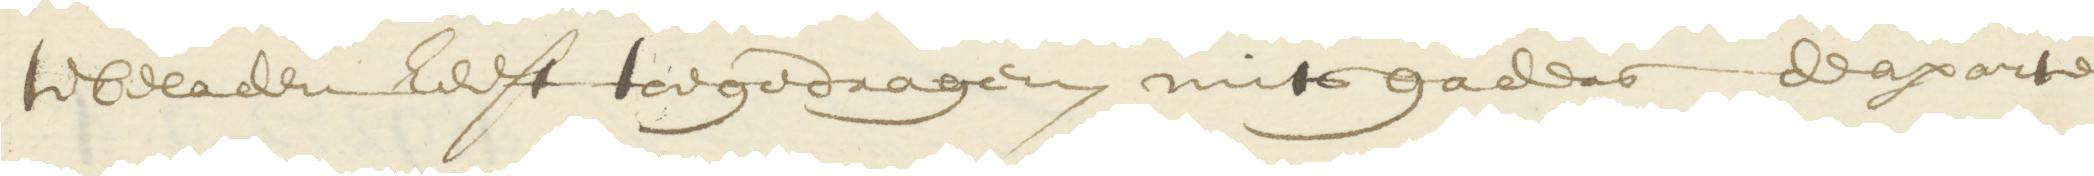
te beladen heeft toegedragen mitsgaders de aparte
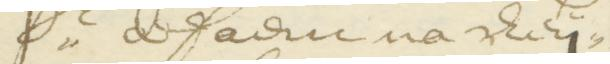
P„r de faem na cheij„
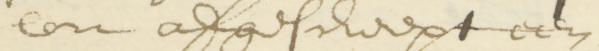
lon afgescheept een
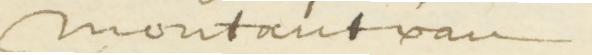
montant van
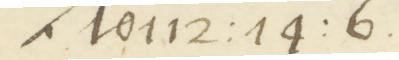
ƒ 10112: 14: 6.
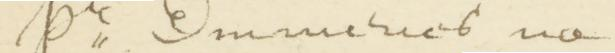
P„r Emmenes na
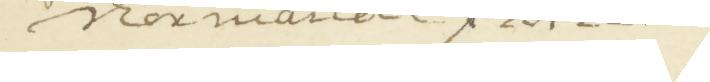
chormandel ƒ2052.2.
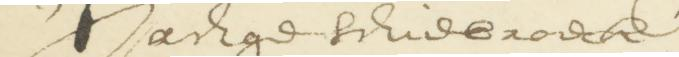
't jachge schiebroeck
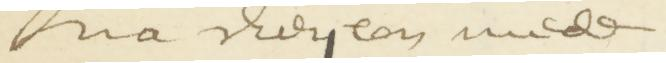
na cheijlon mede
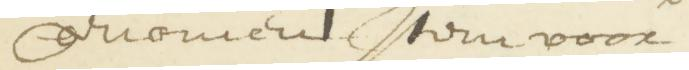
genomen jtem voor
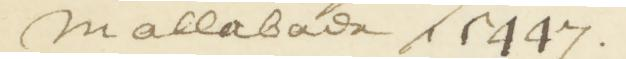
mallabaer ƒ5447.
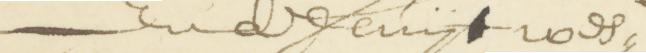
En de fluijt wes„
